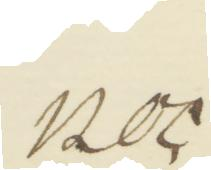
1205
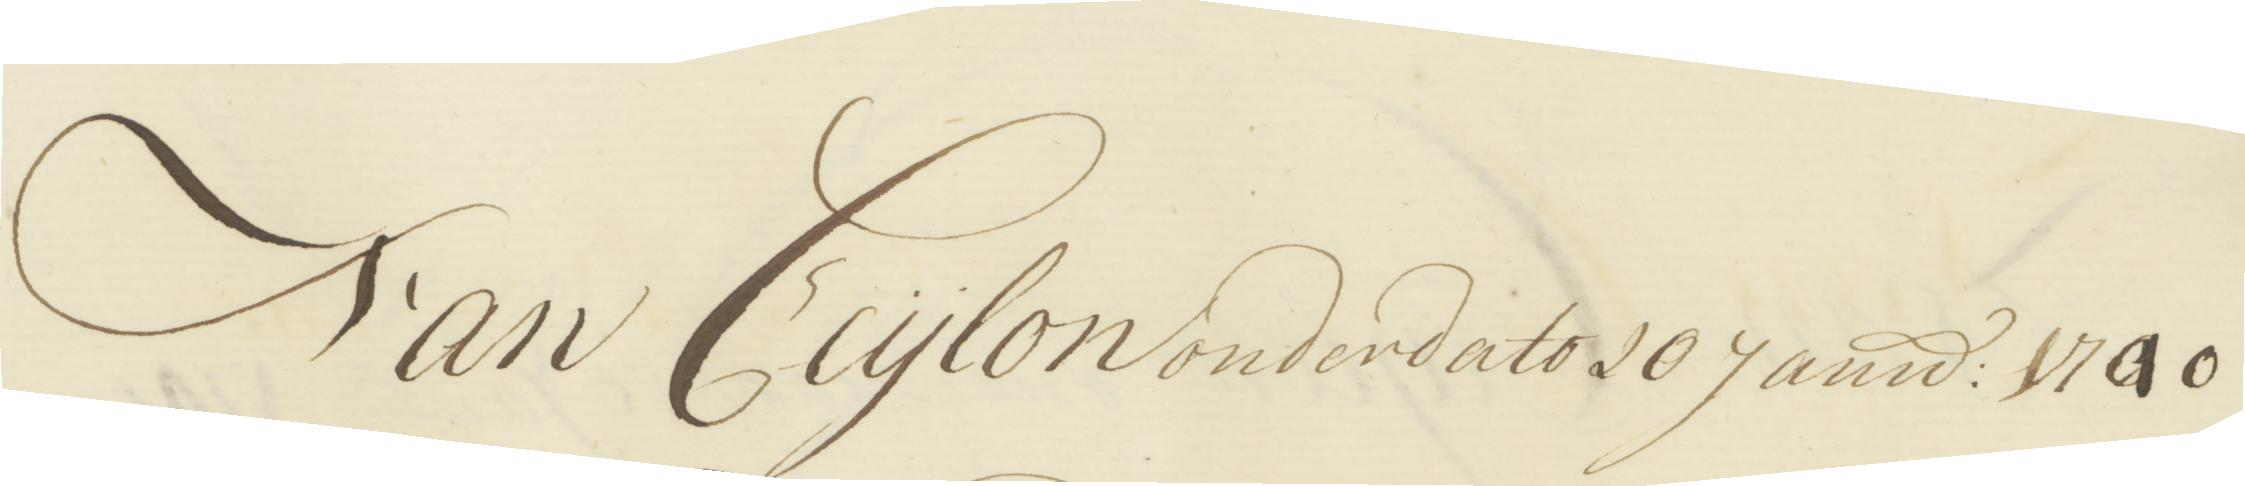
Van Ceijlon onder dato 20 Janu: 1740
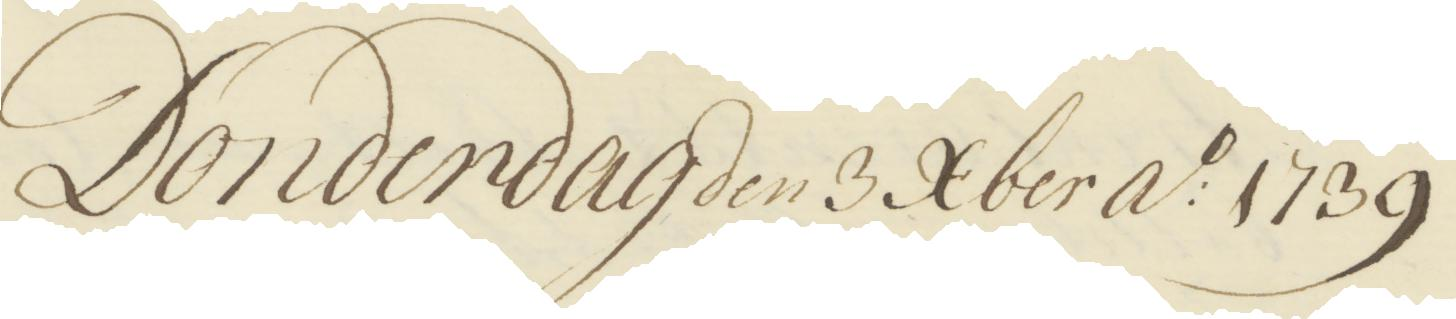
Donderdag den 3 xber a:o 1739
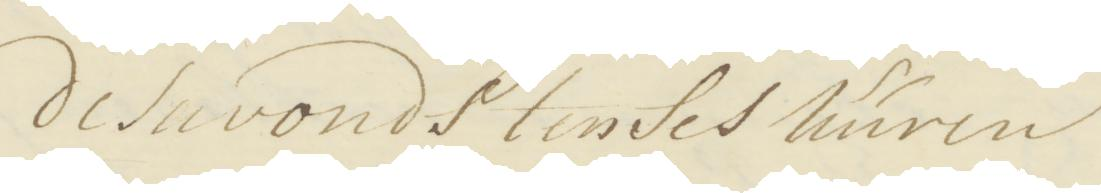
desavonds ten ses uuren
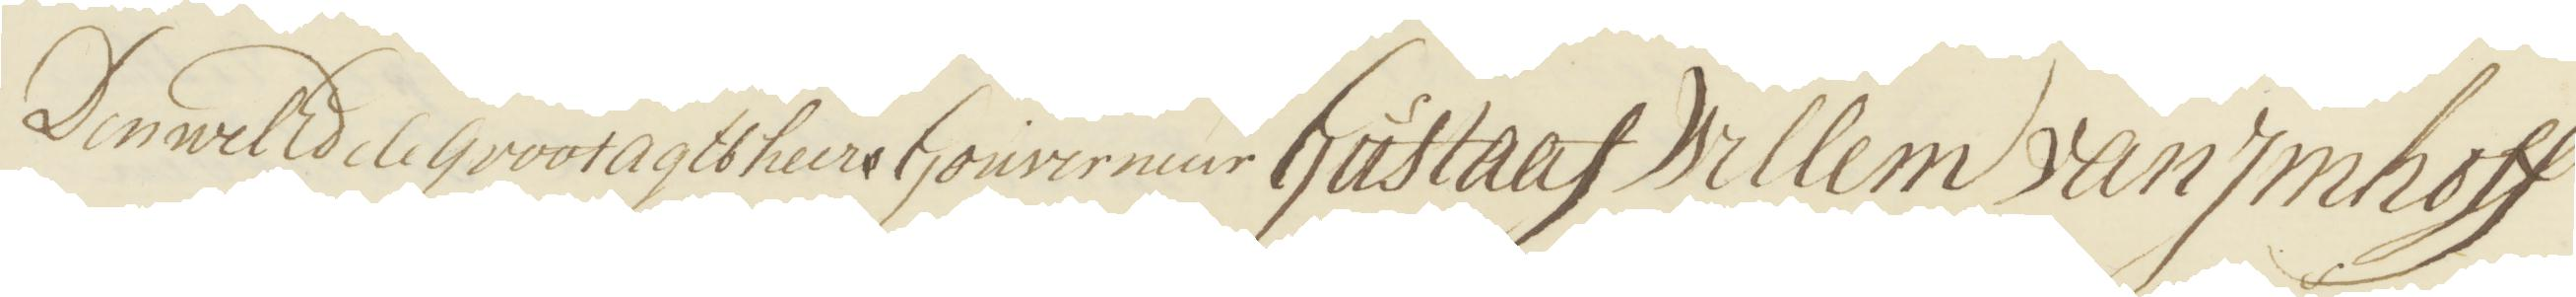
Den wel Edele groot agtb heers Gouverneur Gustaaf Willem van Jmhoff
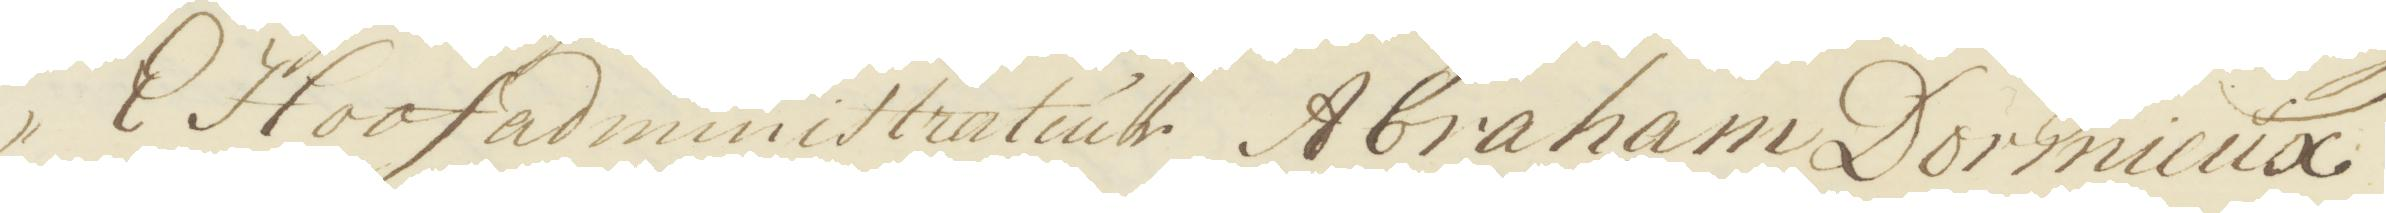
„ E Hoofadministrateur Abraham Dormieux
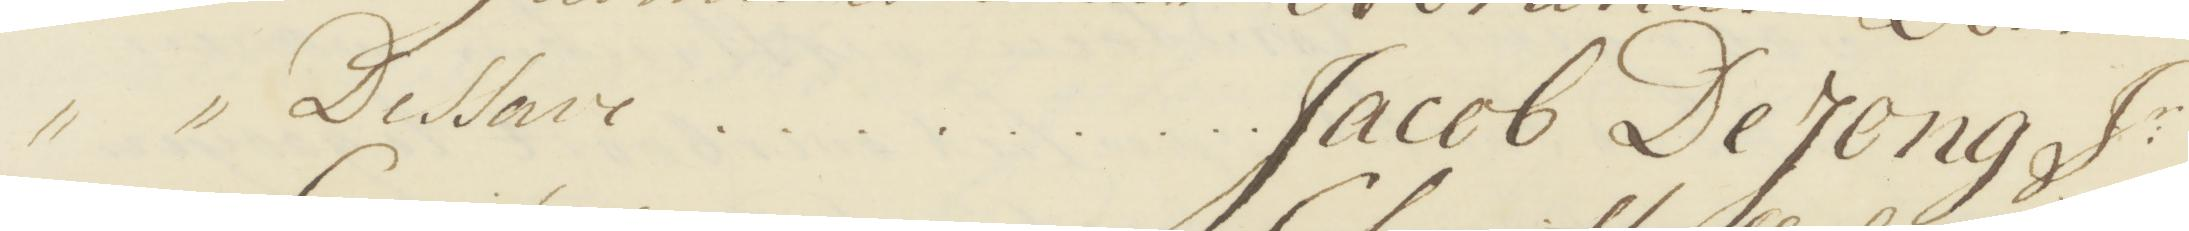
„ „ Dessave . . . . . . . . . . Jacob De Jong J:r
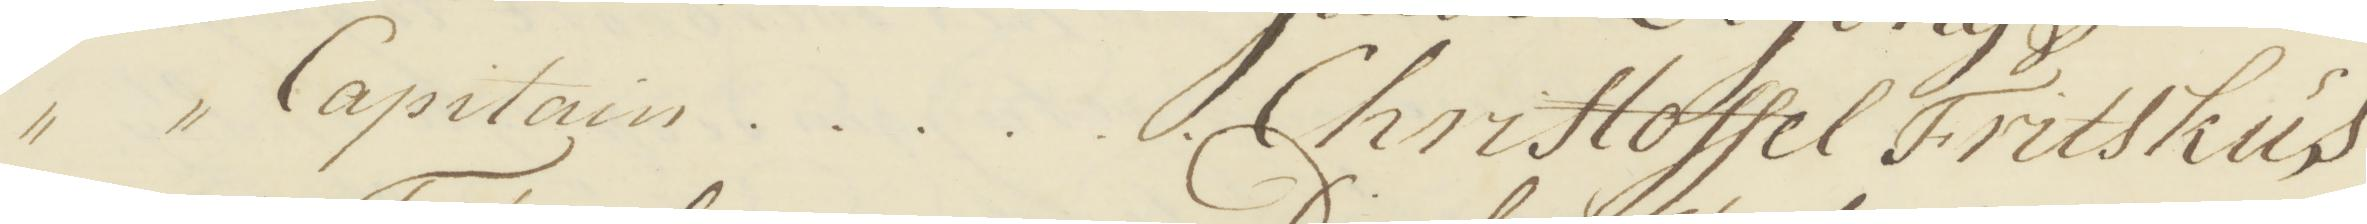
„ „ Capitain . . . . . Christoffel Fritskus
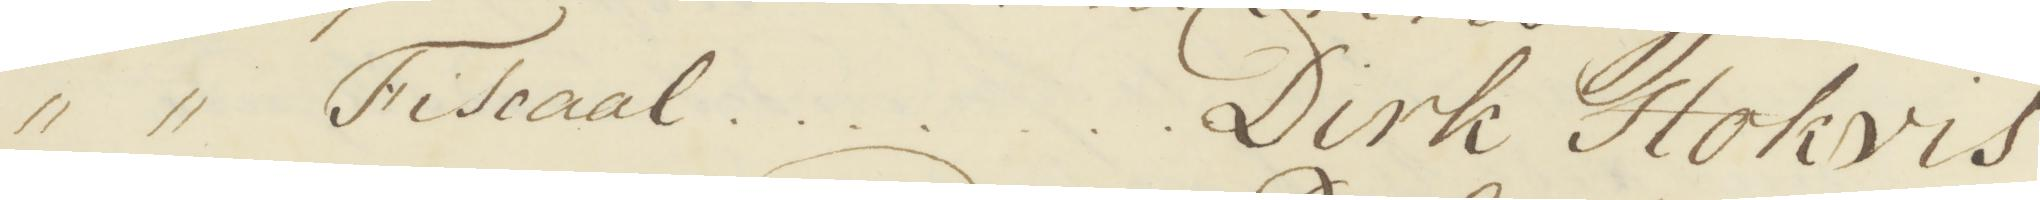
„ „ Fiscaal . . . . . . . Dirk stokvis
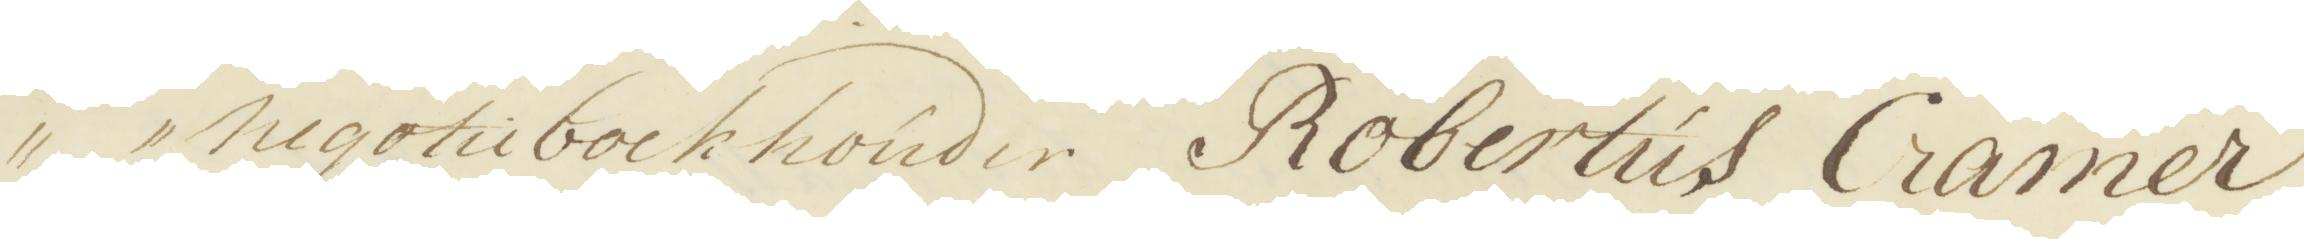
„ „ negotieboekhouder Robertus Cramer
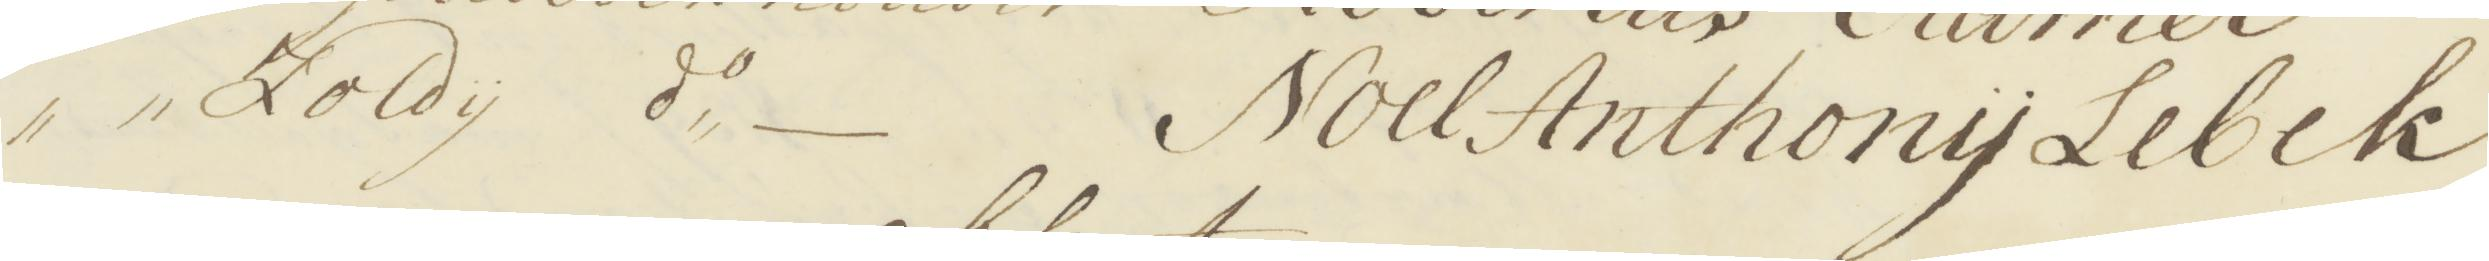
„ „ Zoldij d„o _ Noel Anthonij Lebek
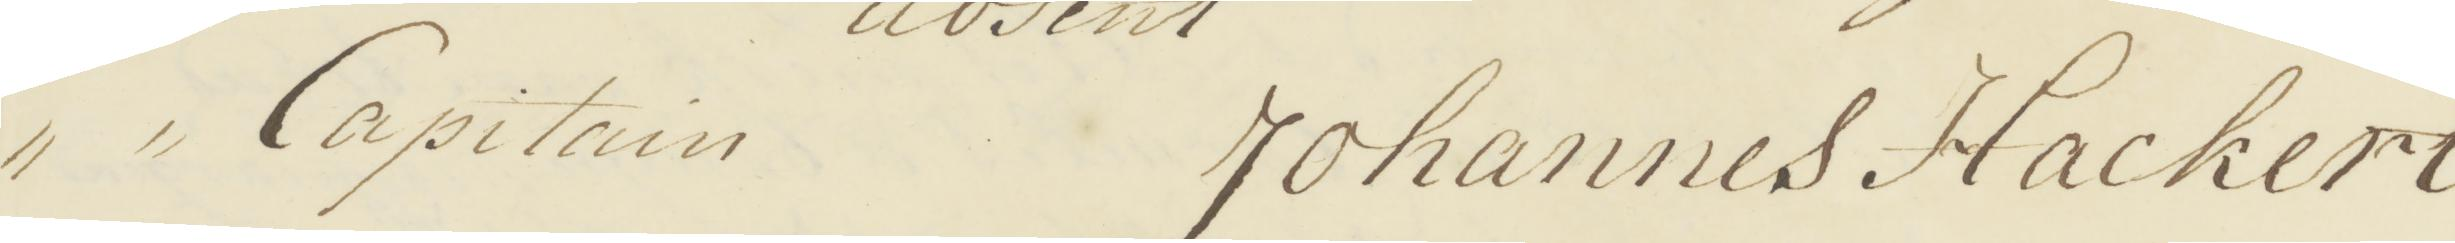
„ „ Capitain Johannes Hackert
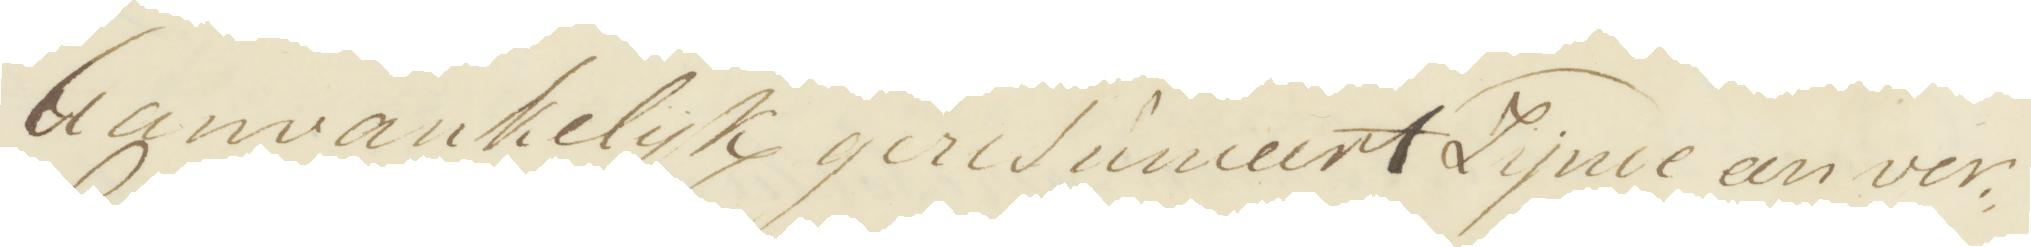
Aanvankelijk geresumeert zijnde een ver„
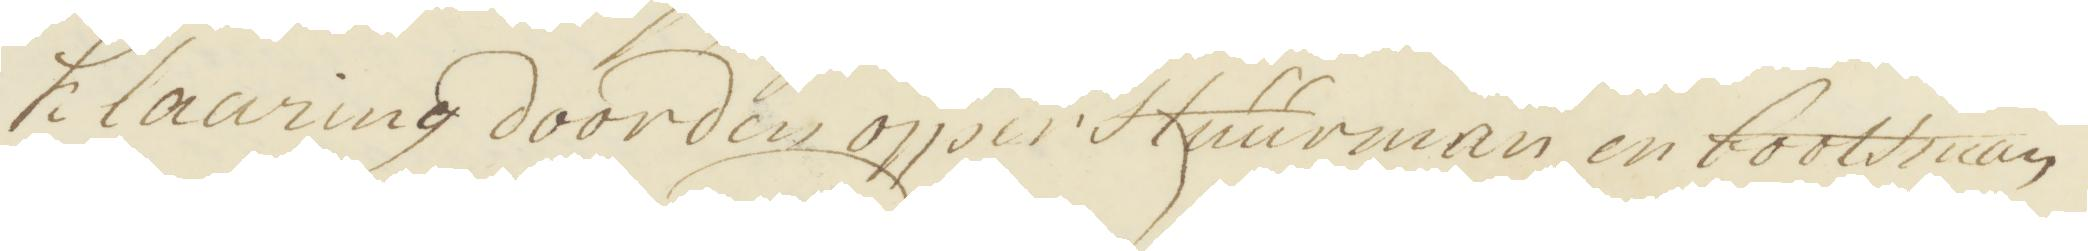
klaaring door den opper stuurman en bootsman
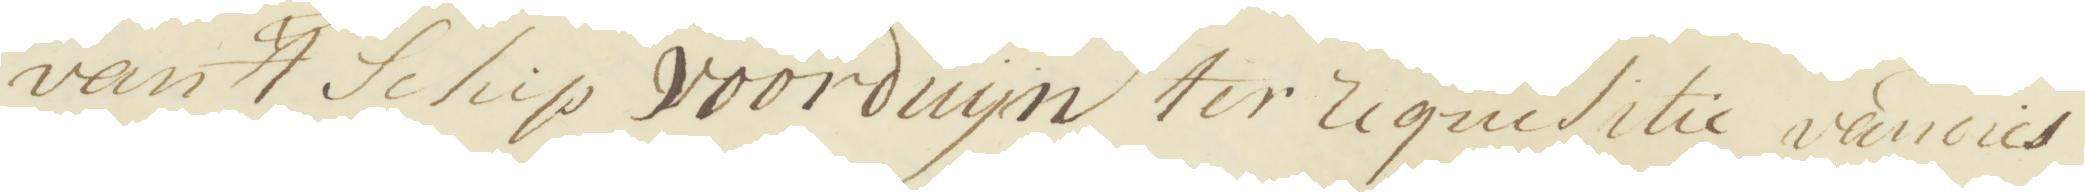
van ’t schip voorduijn ter requisitie van dies
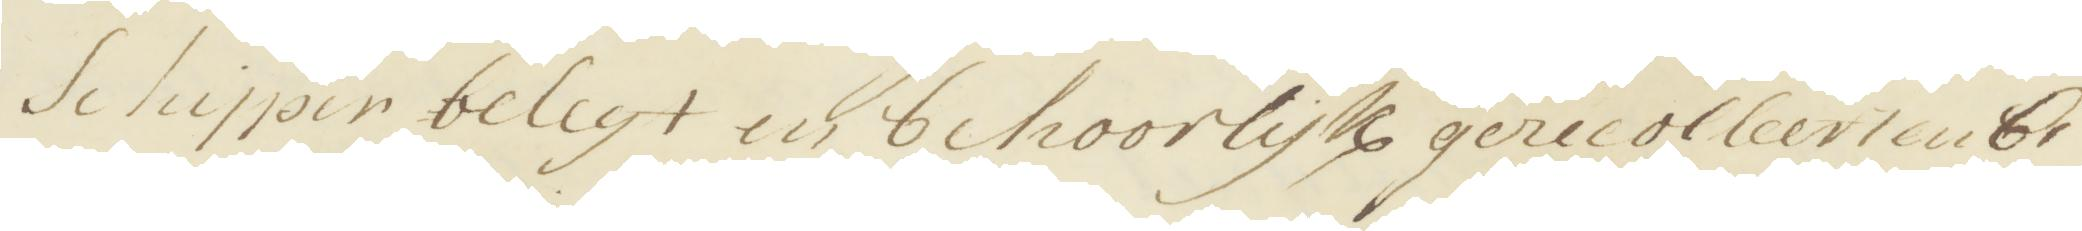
schipper belegt en behoorlijk gerecolleert en b
